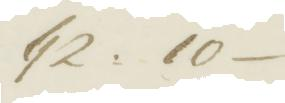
42: 10 —
